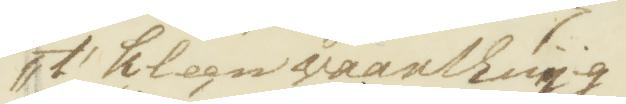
„ t' kleen vaarthuijg
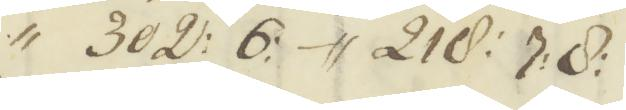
„ 302: 6:—„ 218:7:8:
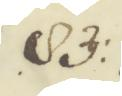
83:18:8:
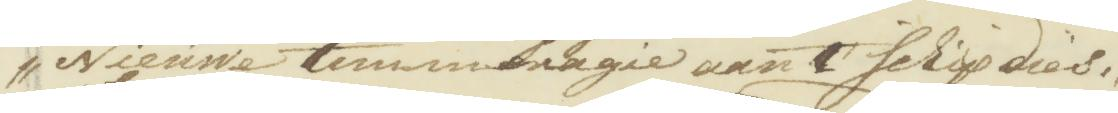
„Nieuwe timmeragie aan ’t schip dies„
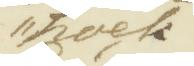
„hoek
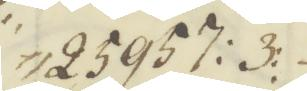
„25957:3:
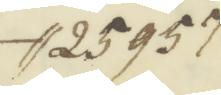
—„25957
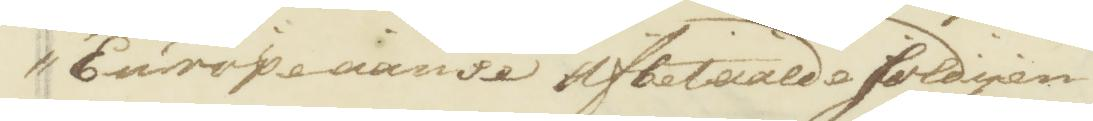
„ Europeaanse afbetaalde soldijen
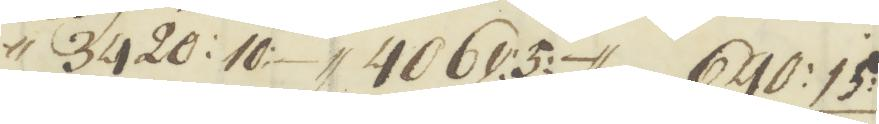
„ 3420:10:—„ 4061:5:–„ 640:15
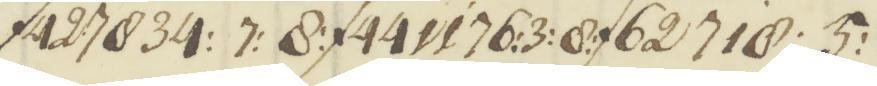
ƒ427834: 7: 8:ƒ441176:3:8:ƒ62718: 5:
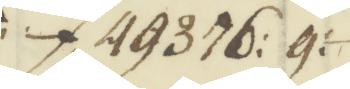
–ƒ 49376:9:
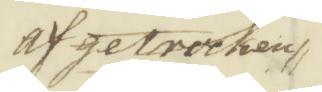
afgetrocken
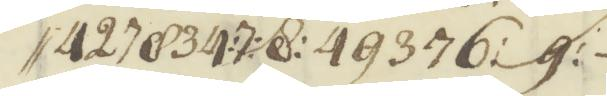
ƒ427834:7:8: 49376: 9:
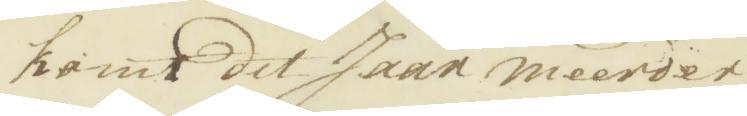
komt dit Jaar meerder
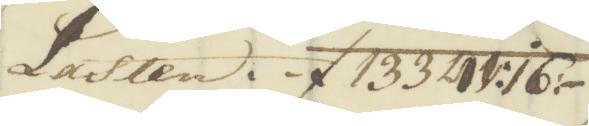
Lasten: ƒ 13341:16:-
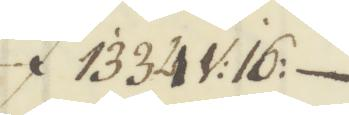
ƒ 13341:16:—
